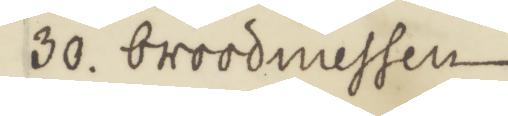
30. broodmessen
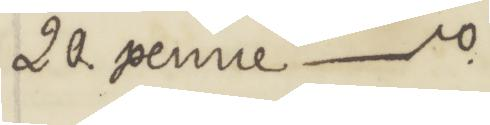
2. penne _.o
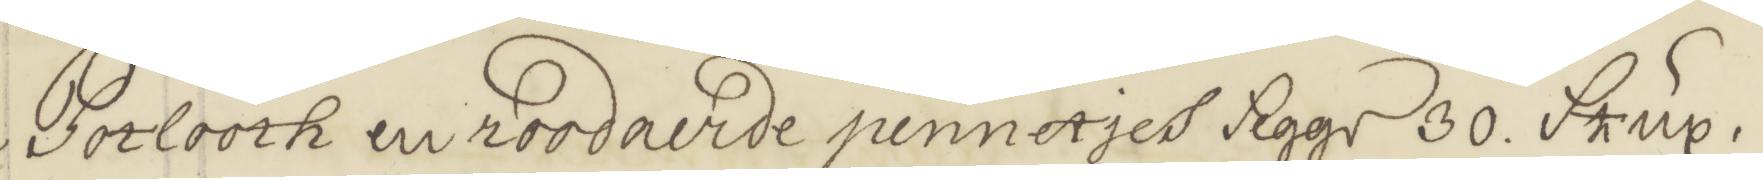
Potlooth en roodaerde pennetjes segge 30. stux.
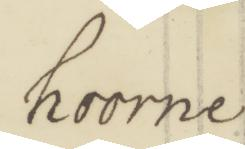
hoorne
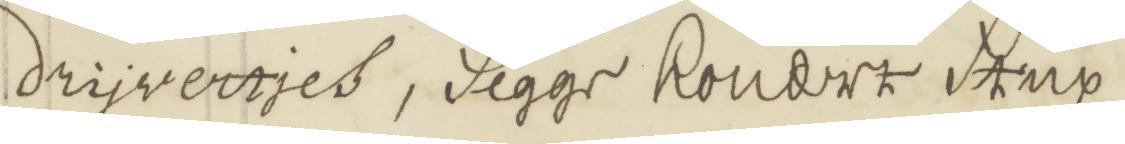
drijvertjes, segge hondert stux
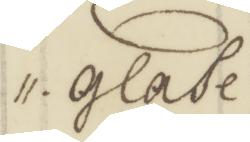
„. glase
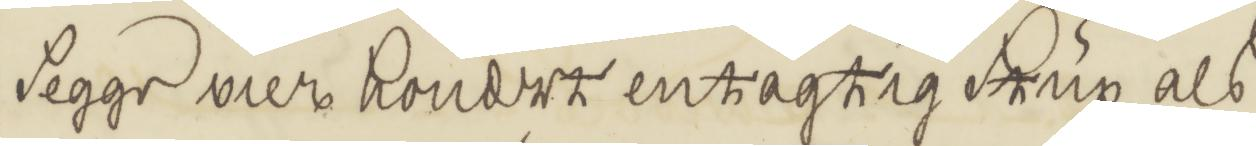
segge vier hondert en tagtig stux als
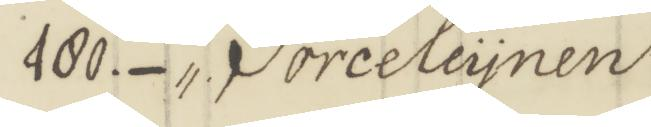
480.– „. Porceleijnen
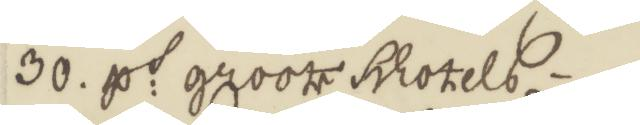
30. p:s groote schotels - -
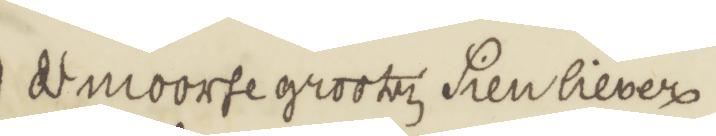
de moorse grooten sien liever
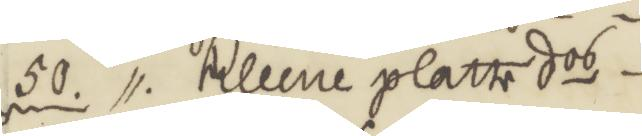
5. „. kleene platte d-os
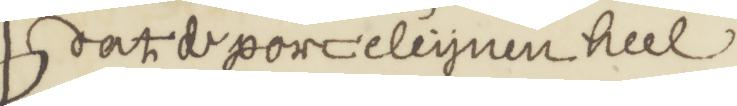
dat de porceleijnen heel
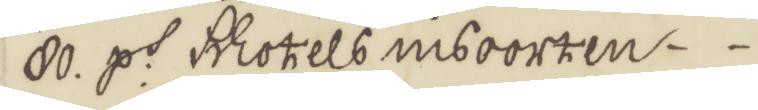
80. p:s schotels insoorten - -
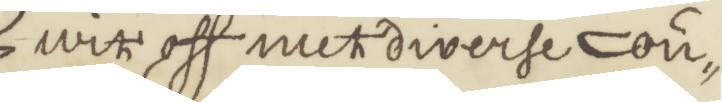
wit off met diverse cou„
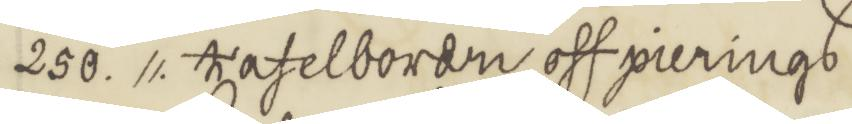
250. „. tafelborden off pierings
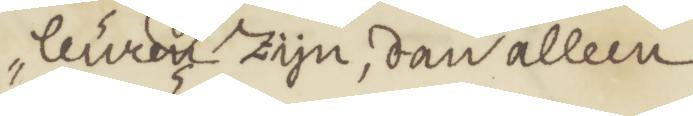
„leuren zijn, dan alleen
